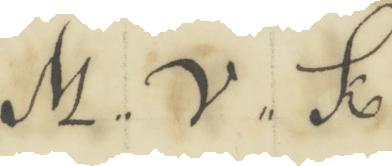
M„ V„ K
